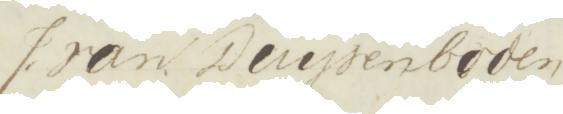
J. van Duyvenboden
